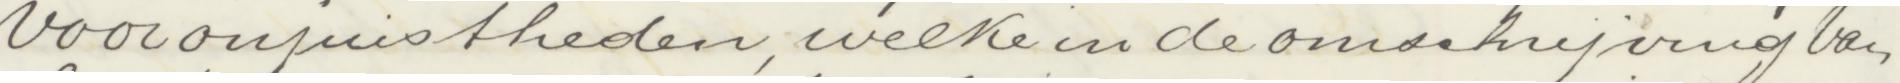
voor onjuistheden, welke in de omschrijving van
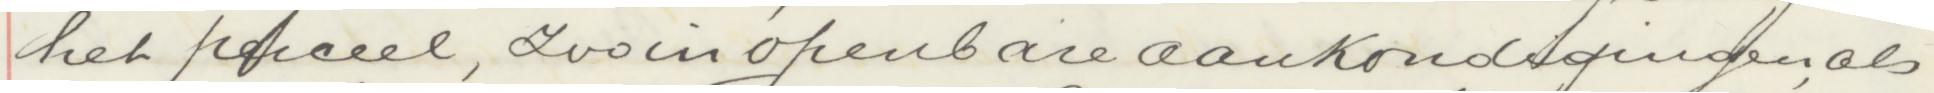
het perceel, zoo in openbare aankondigingen, als
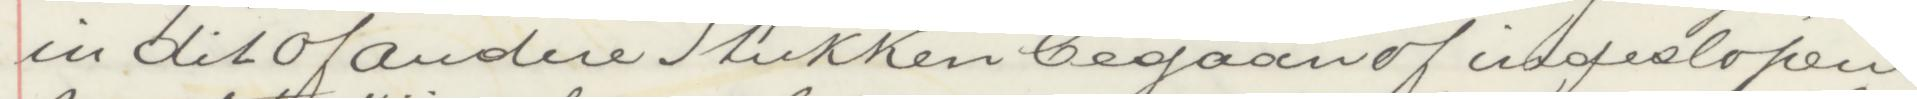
in dit of andere stukken begaan of ingeslopen
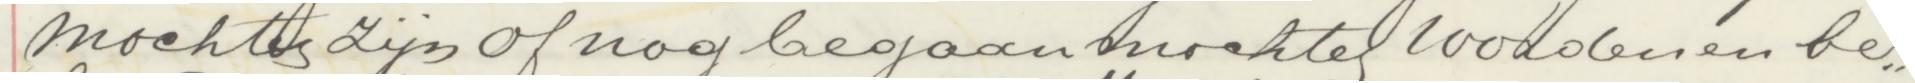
mochten zijn of nog begaan mochten worden en be„
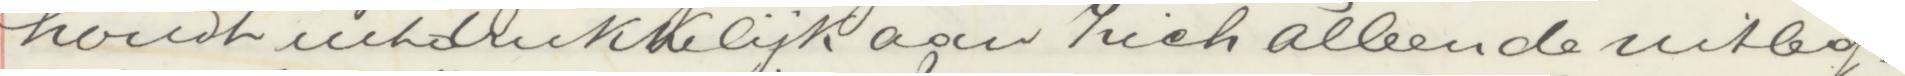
houdt uitdrukkelijk aan zich alleen de uitleg„
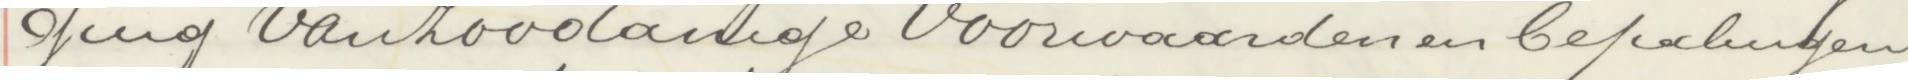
ging van zoodanige voorwaarden en bepalingen,
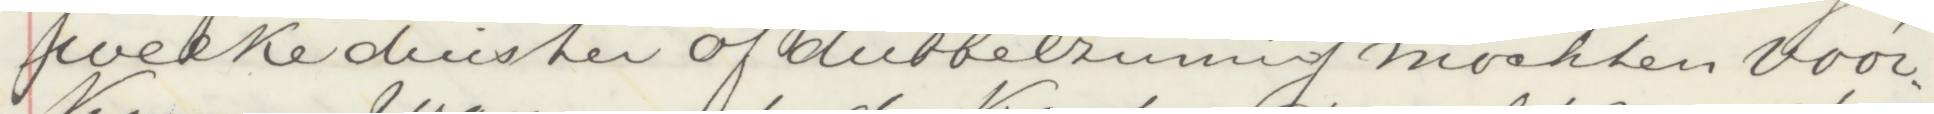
welke duister of dubbelzins mochten voor„
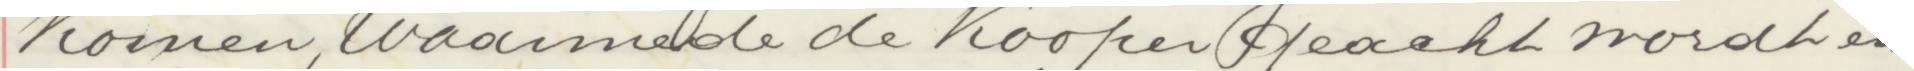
komen, waarmede de Kooper geacht wordt en
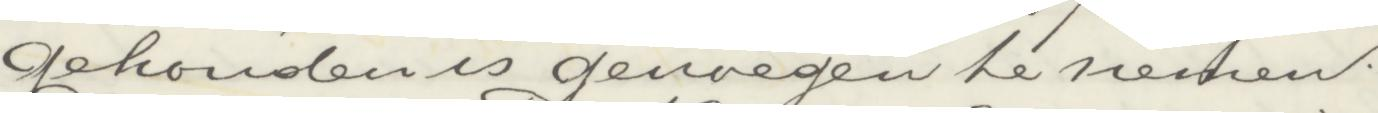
gehouden is genoegen te nemen.
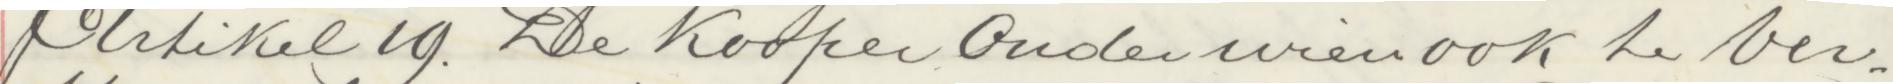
Artikel 19. De Kooper Onder wien ook te ver„
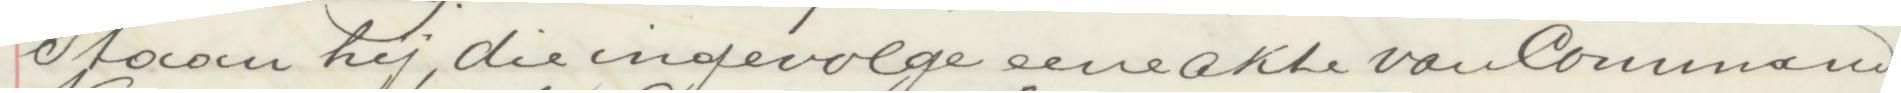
staan hij, die ingevolge eene akte van Command
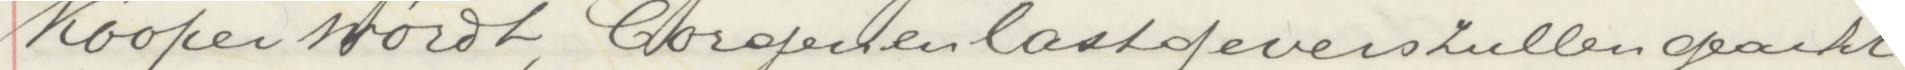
Kooper wordt, borgen en lastgevers zullen geacht
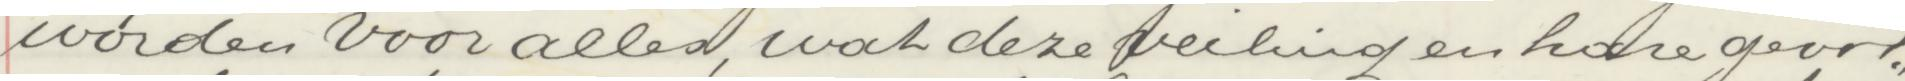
worden voor alles, wat deze veiling en hare gevol„
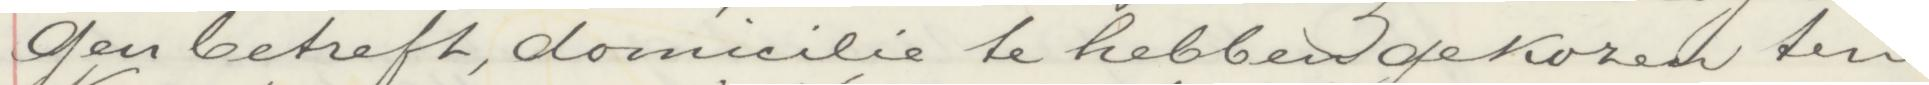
gen betreft, domicilie te hebben gekozen ten
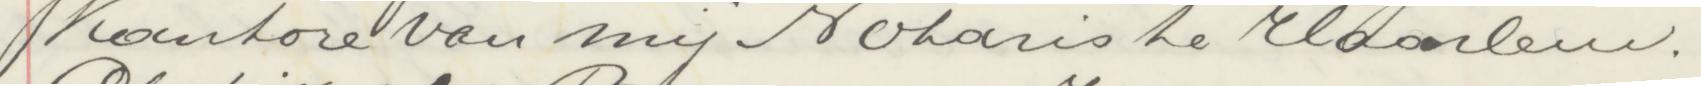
Kantore van mij Notaris te Haarlem.
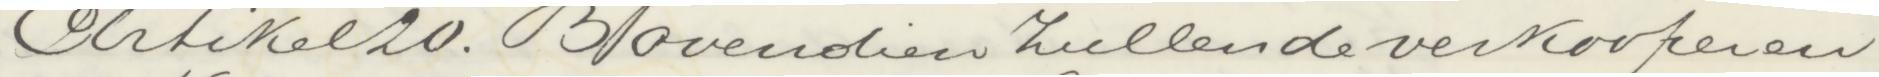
Artikel 20. Bovendien zullen de verkooper en
